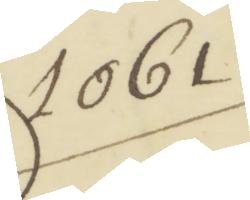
1061
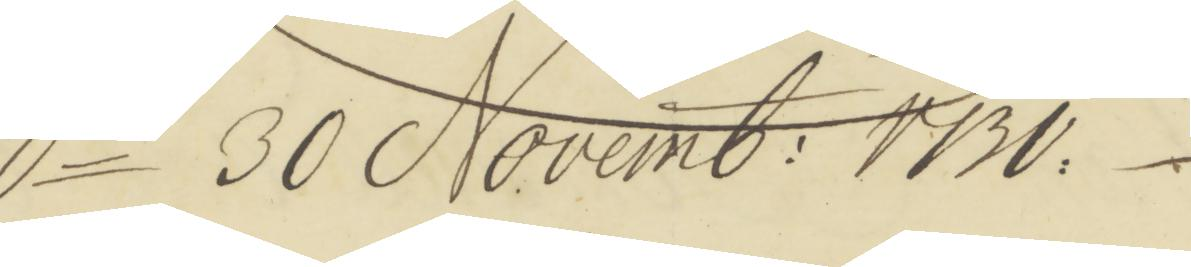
30 Novemb: 1730:-
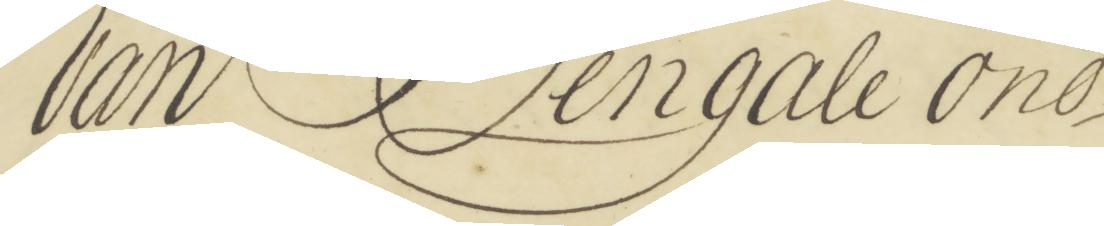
Van Bengale ond:r D=to
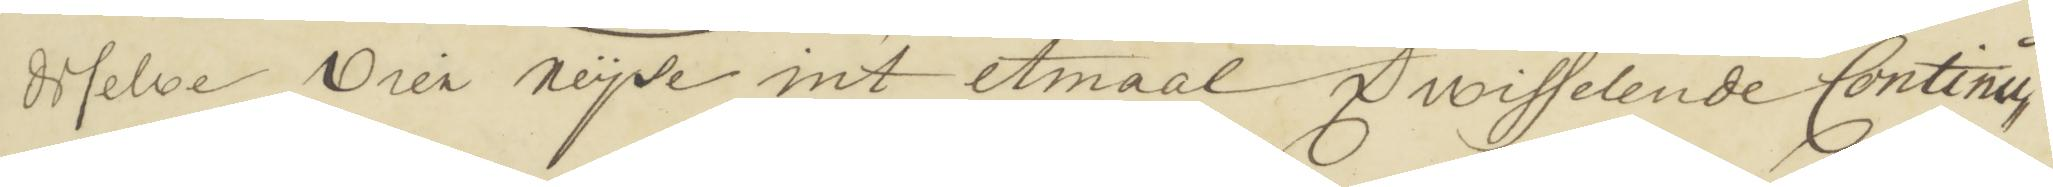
deselve vier reijse in't etmaal verwisselende Continu„
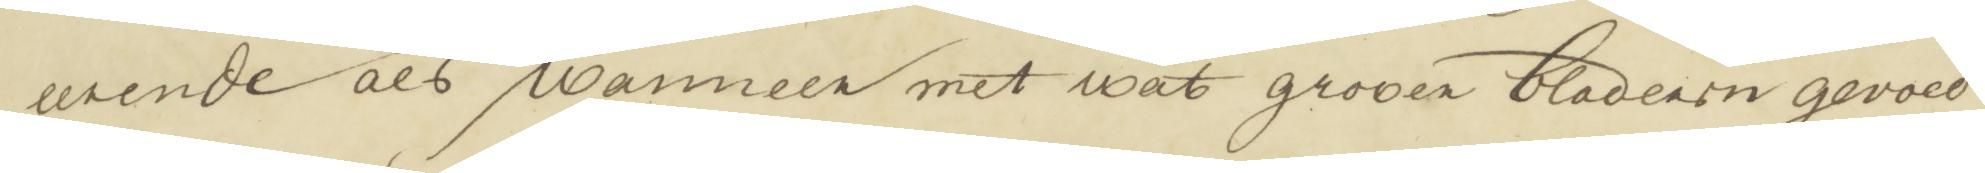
eerende als wanneer met wat grover bladeren gevoed
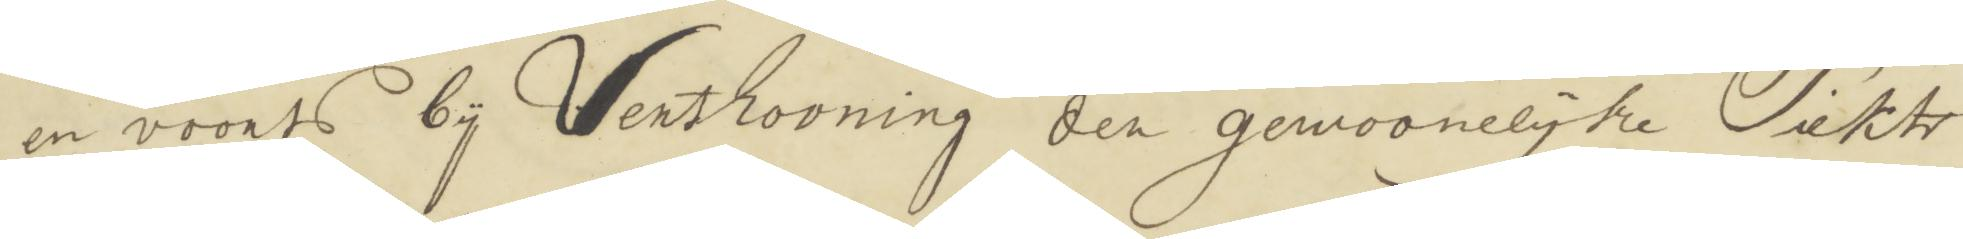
en voorts bij Verthooning der gewoonelijke Siekte
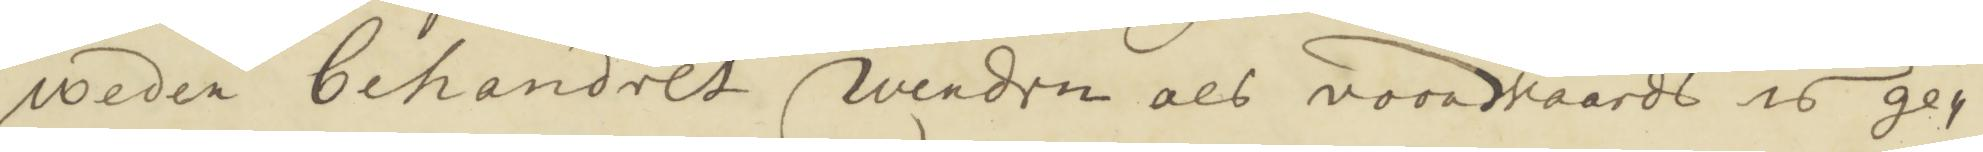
weder behandelt werden als voorwaards is ge„
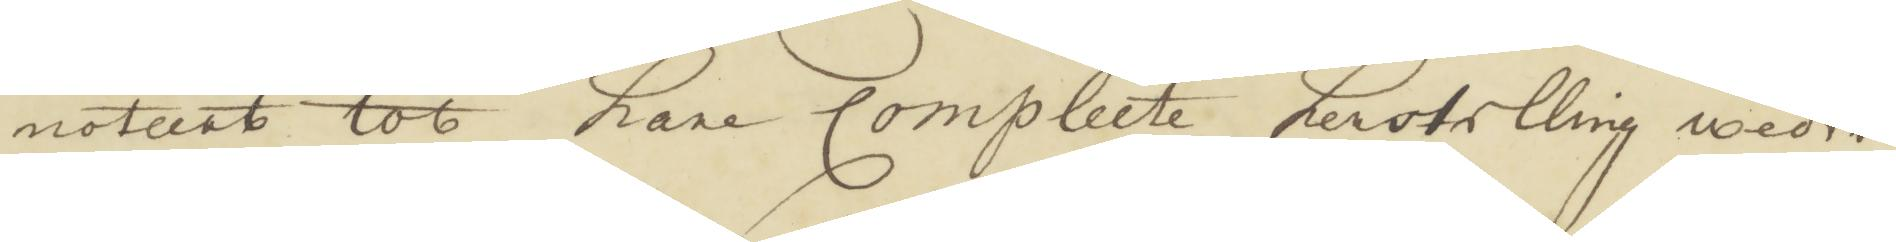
noteert tot hare Compleete herstelling weder
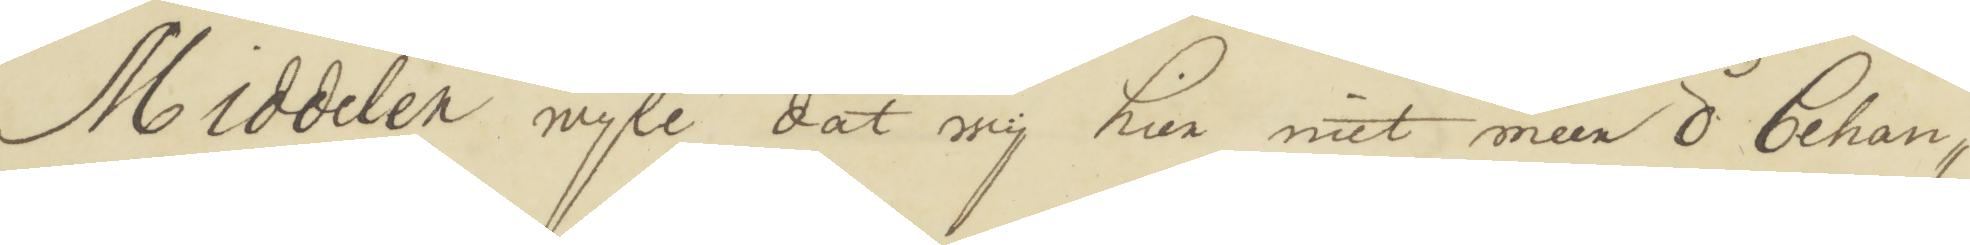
Middeler wijle dat wij hier niet meer d’ behan„
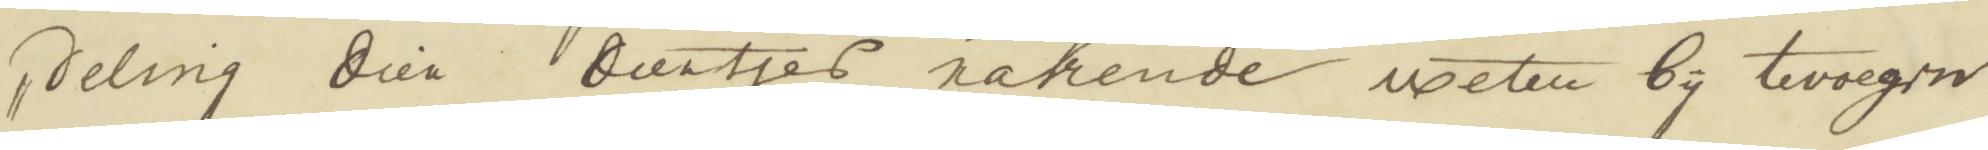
„deling dier diertjes rakende weten bij tevoegen
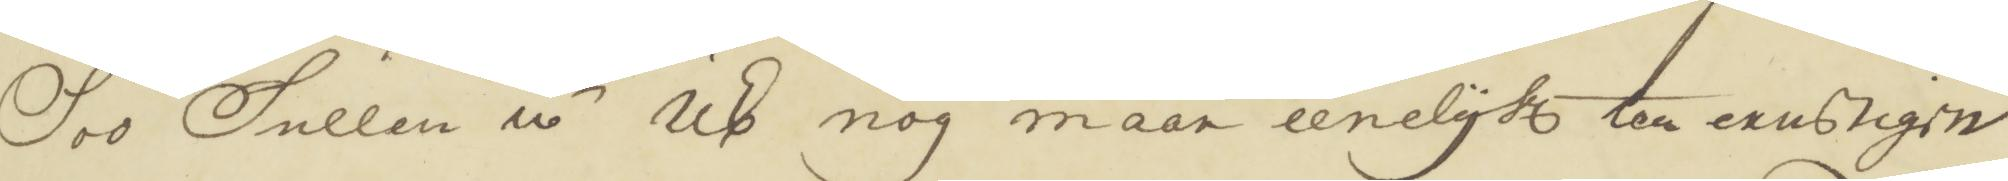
Soo Sullen w' UE nog maar eenelijk ten ernstigen
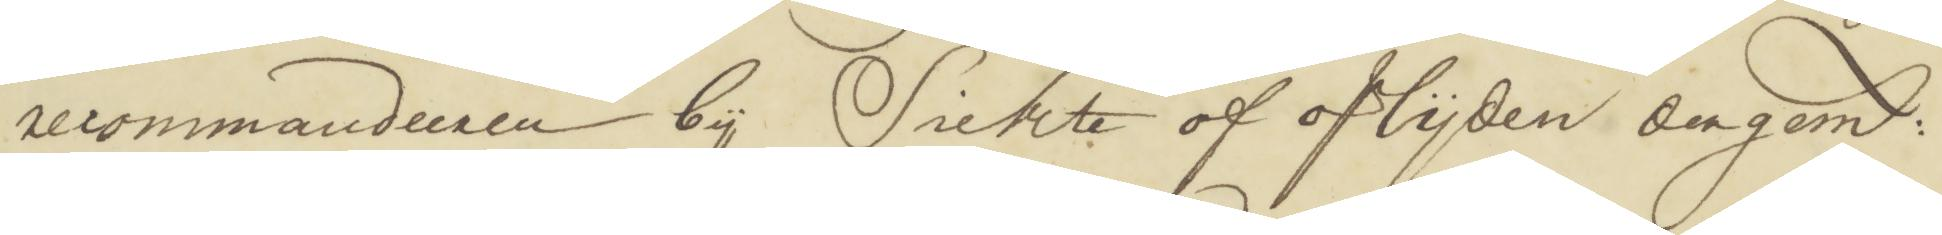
recommandeeren bij Siekte of overlijden der gem:
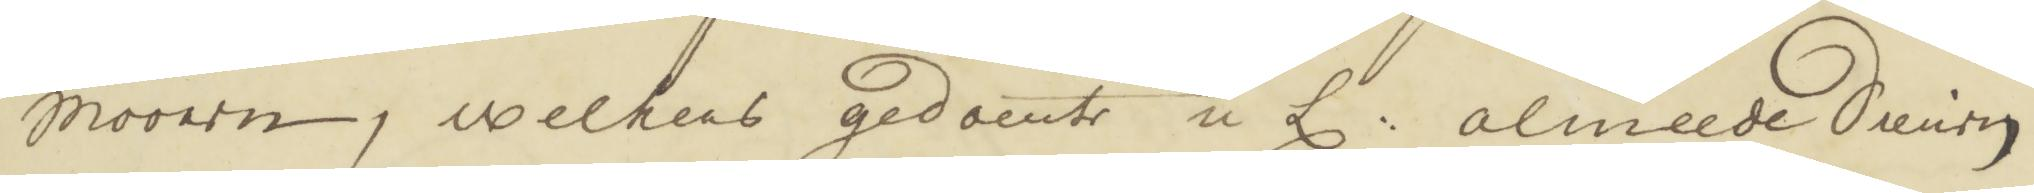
mooren, welkers gedoente u L: almeede dienen
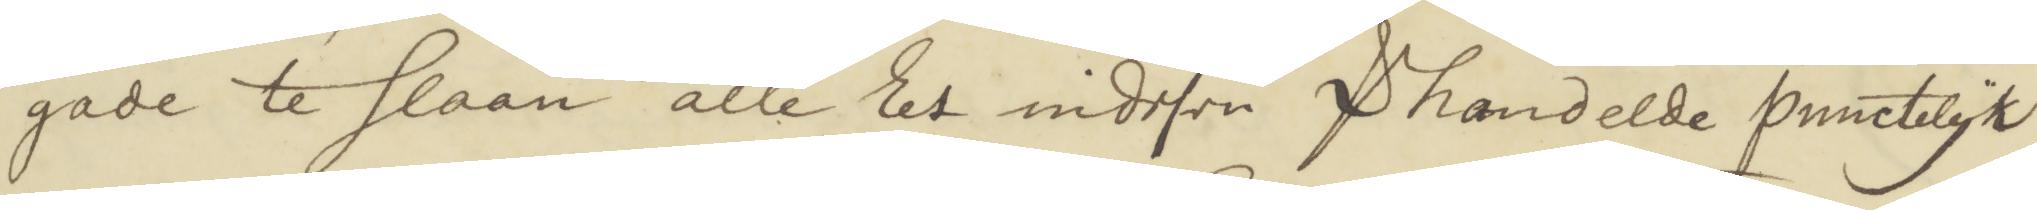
gade te Slaan alle het indesen verhandelde punctelijk
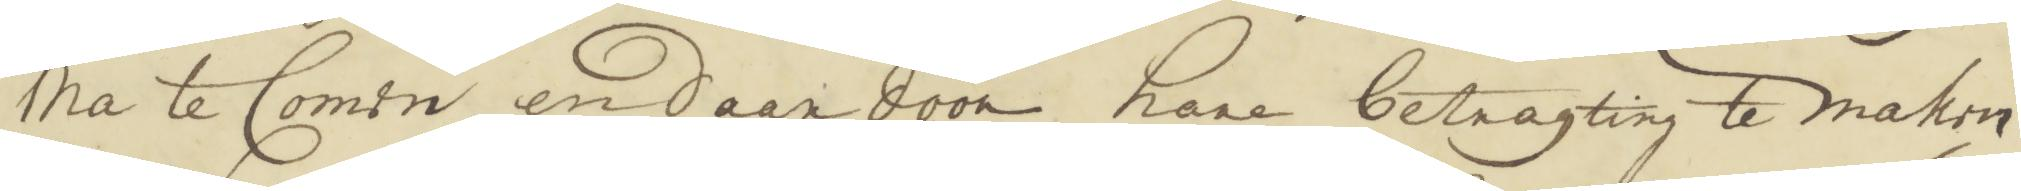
Na te Comen en daar door hare betragting te maken
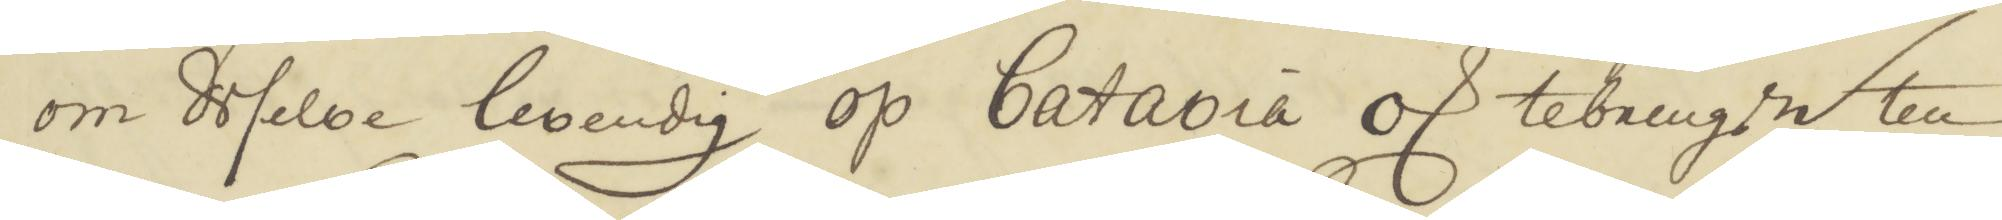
om deselve levendig op batavia over tebrengen ten
